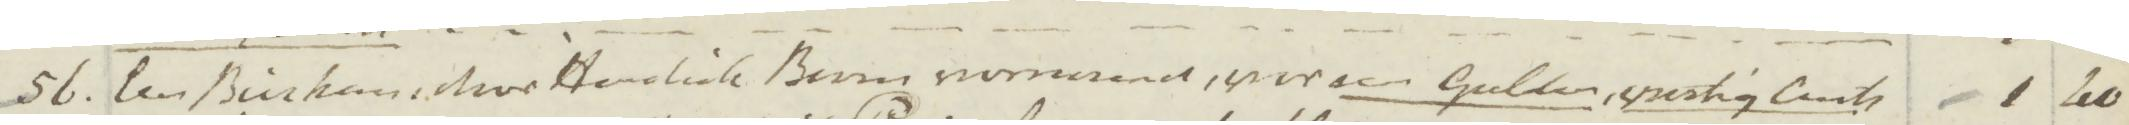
56. Een Bierkan, door Hendrik Boom voornoemd, voor een Gulden, veertig Cents —1 40
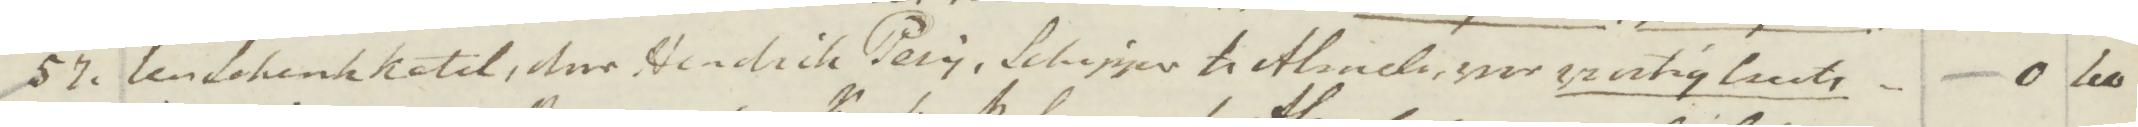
57. Een schenkketel, door Hendrik Perij, schipper te Almelo, voor veertig Cents- 0 40
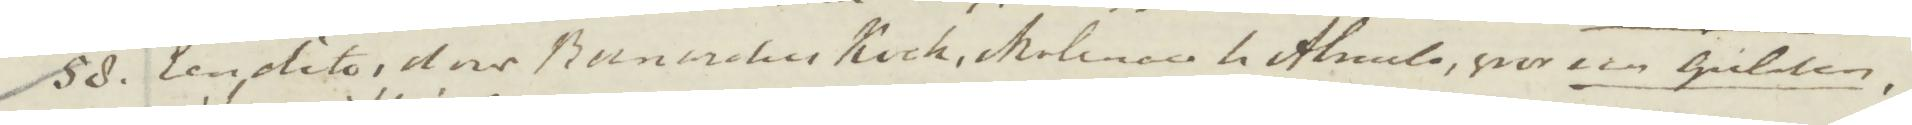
58. Een dito, door Bernardus Koek Molenaar te Almelo, voor een Gulden,
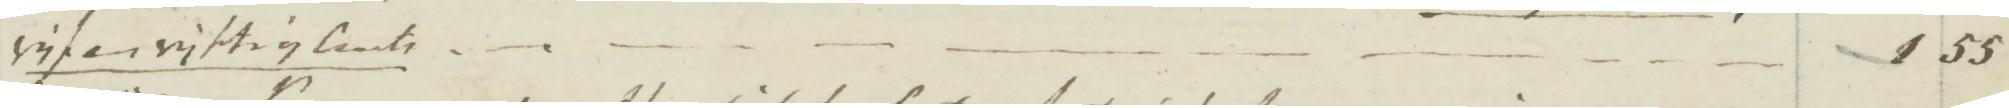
Vijf en vijftig Cents - - - - - - - - - - - - - - - - - - - - - - - - - - - - - - -- - - - - - - - - - 1 55
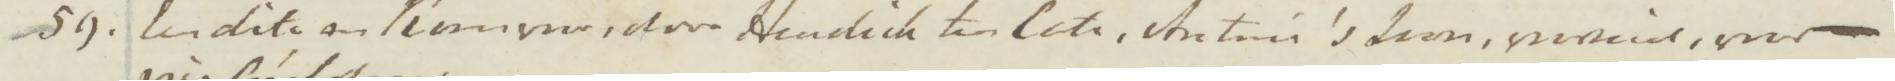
59. Een dito en Komvoor, door Hendrik ten Cate, Antoni 's Zoon, voorzeid, voor
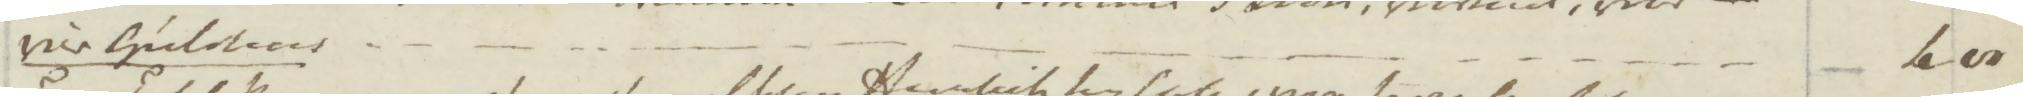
vier Guldens - - - - - - - - - -- - - - - - - - - - - - - - - - - - - - - - - - - - - - - - -- -- - —4 00
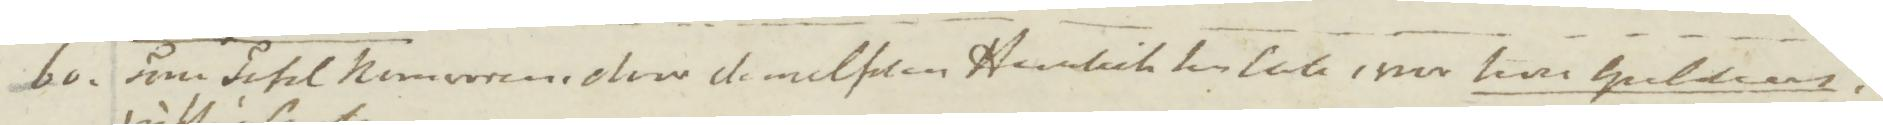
60. Twee tafel Komvoren, door denzelfden Hendrik ten Cate voor twee Guldens.
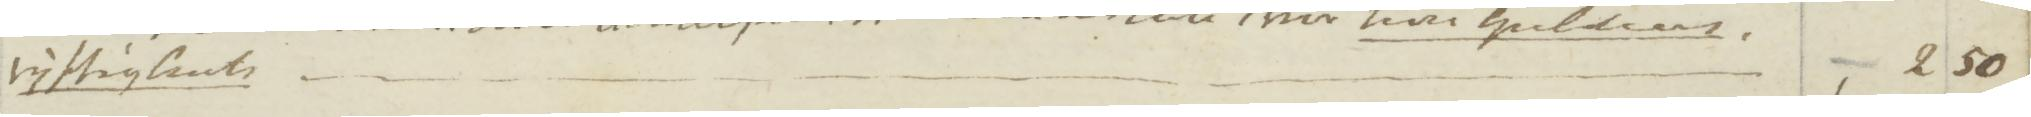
vijftig Cents - - - - - - - - - - - - - - - - - - - - - - - - - - - - - - - - - - - - - - - - -- - - - - - —2 50
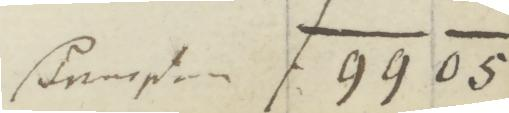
Transpt ƒ 99 05
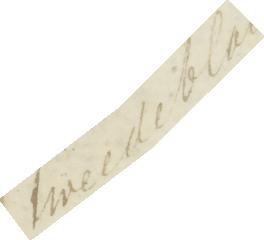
twee de blad
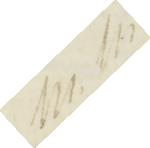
na tes
